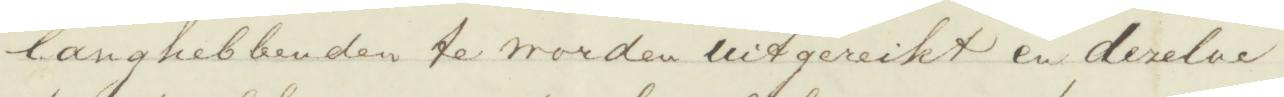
langhebben den te worden uitgereikt en dezelve
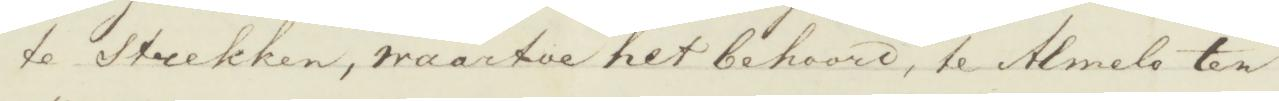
te strekken, waartoe het behoord, te Almelo ten
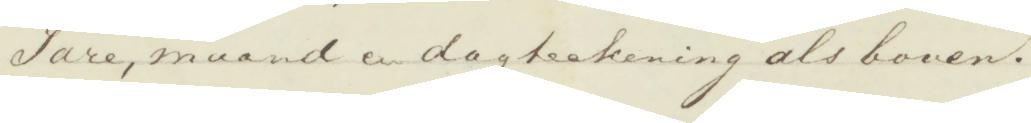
Iare, maand en dagteekening als boven.
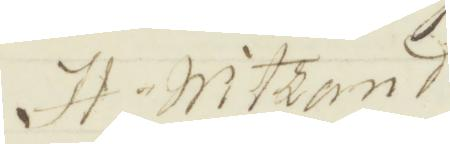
H: Witzand
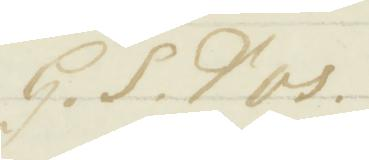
G. S. Vos.
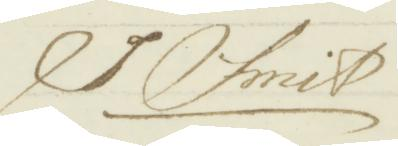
J Smit
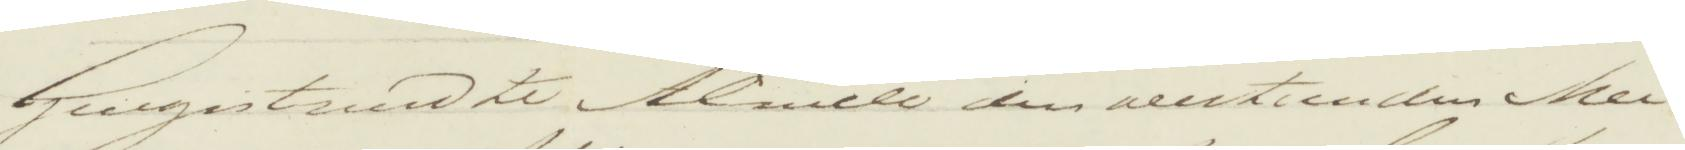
Geregistreerd te Almelo den veertienden Mei
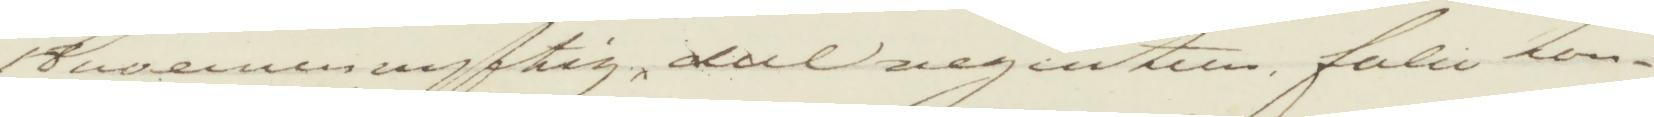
1800 een en vyftig, deel negentien, folio hon=
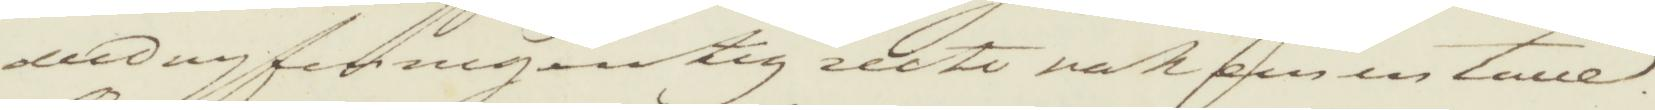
derd vyfennegentig recto vak een en twee
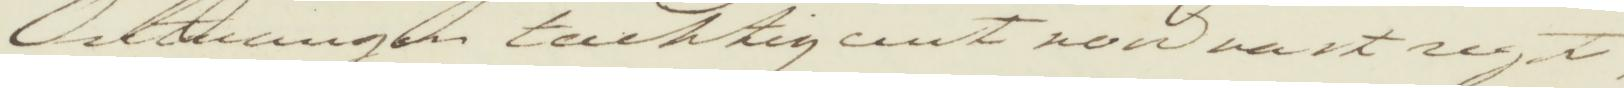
Ontvangen tachtig cent voor vast regt
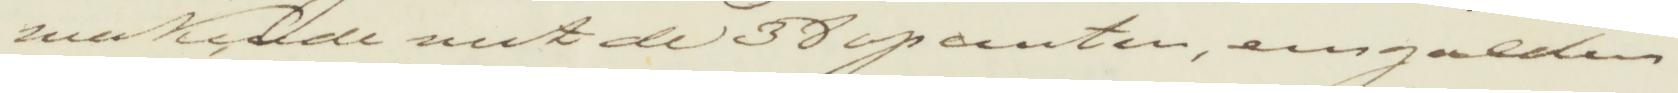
makende met de 38 opcenten, een gulden
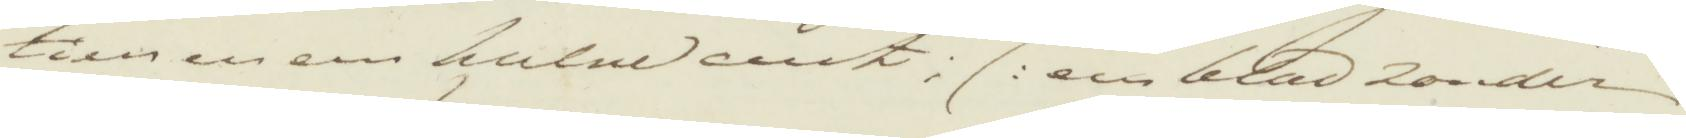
tien en een halve cent: (: een blad zonder
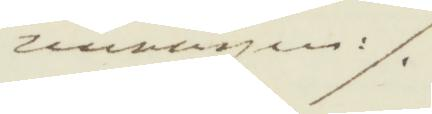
renvoyen:)
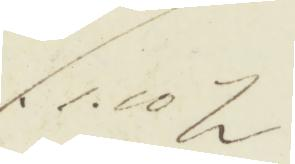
f 1.10 ½
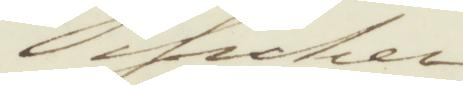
Visscher
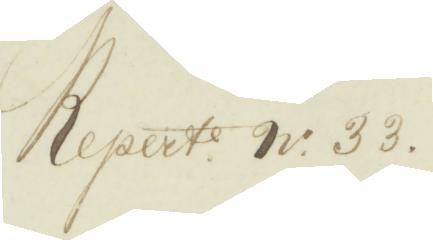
Repert: n:o 33.
